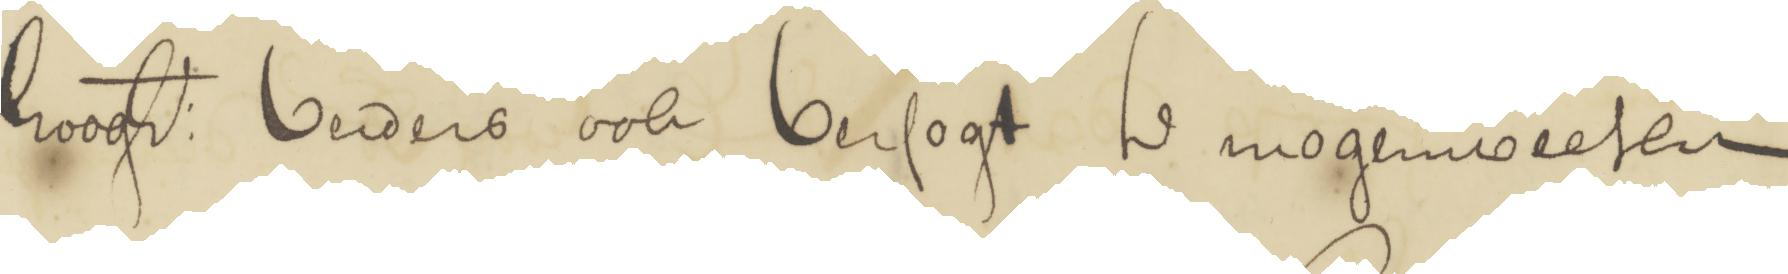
hoogh:t verders ook versogt te mogen weesen
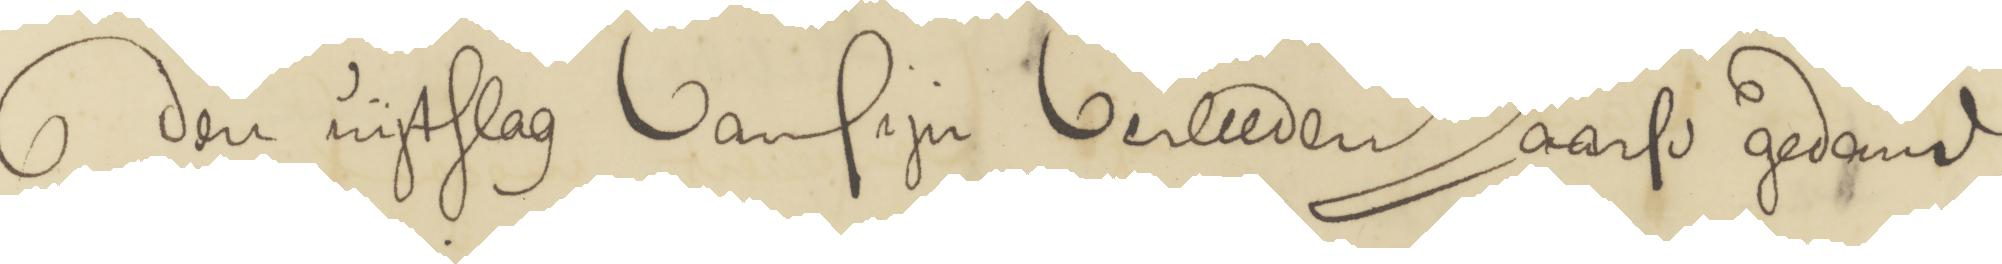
den uijtslag van sijn verleeden Jaarse gedane
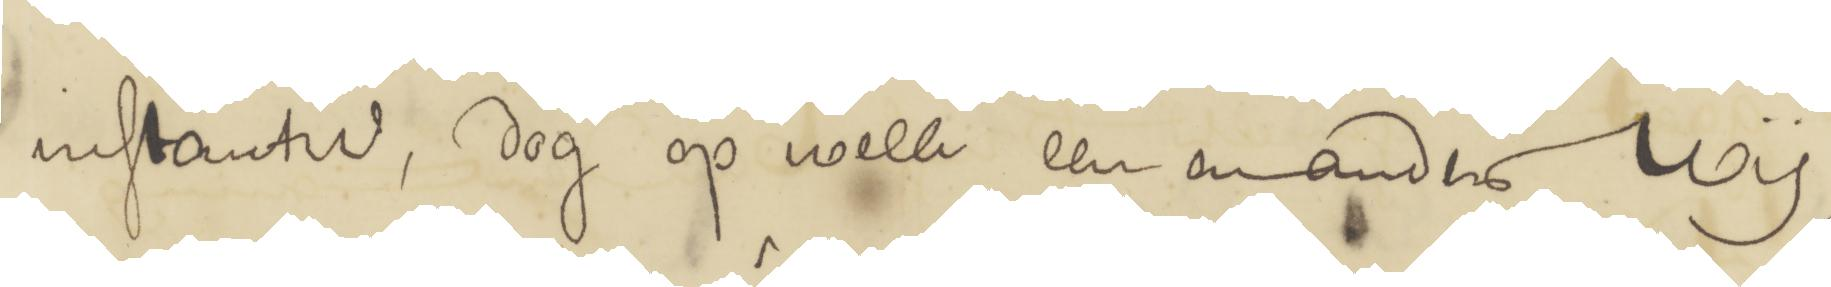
instantie, dog op welk een en ander wij
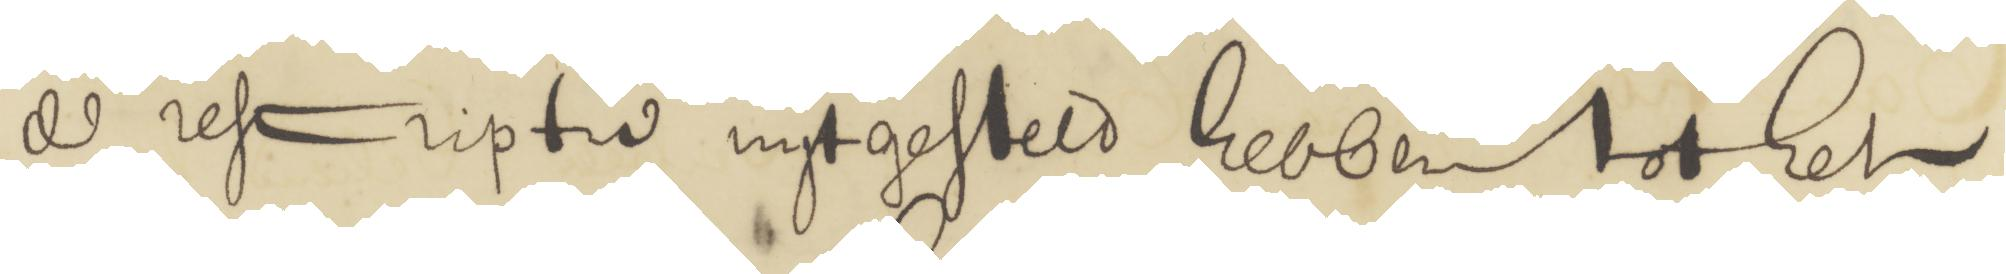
de rescriptie uijtgesteld hebben tot het
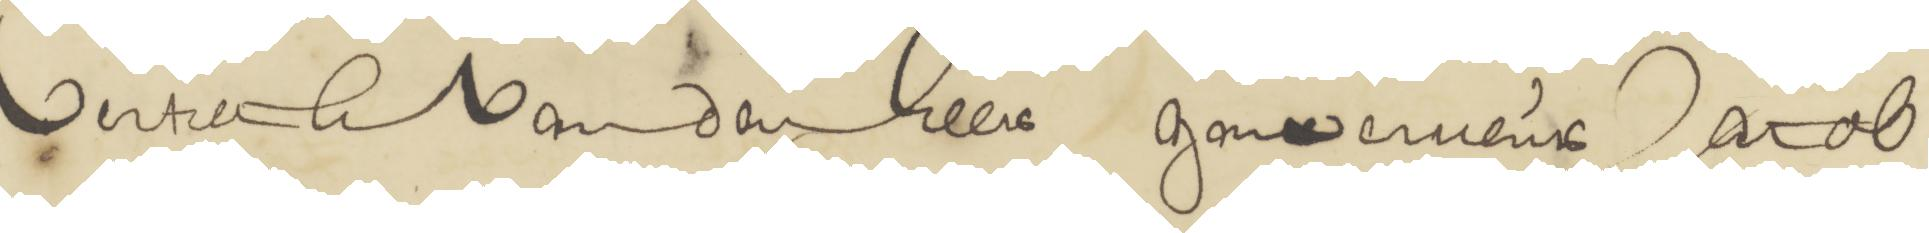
vertreck van den heer gouverneur Jacob
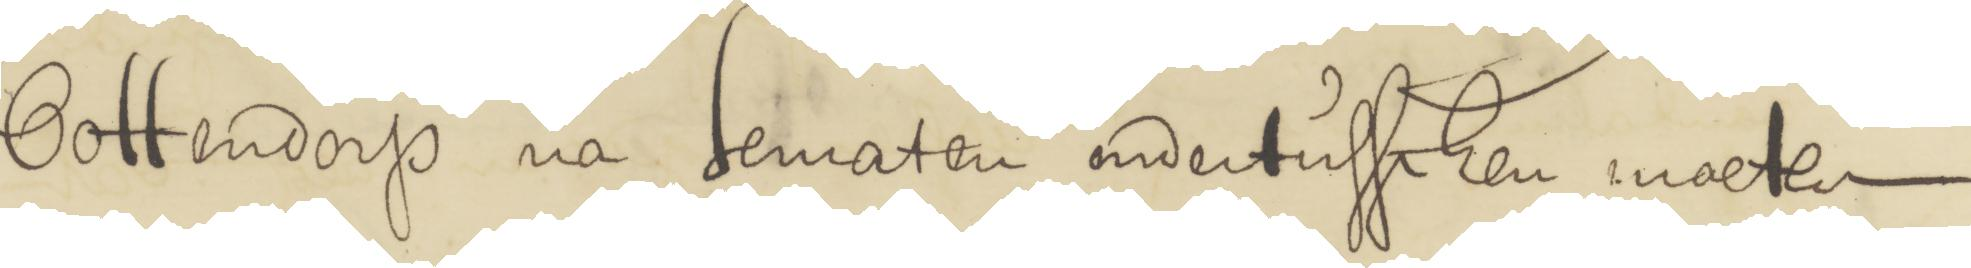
bottendorp na Ternaten ondertusschen moeten
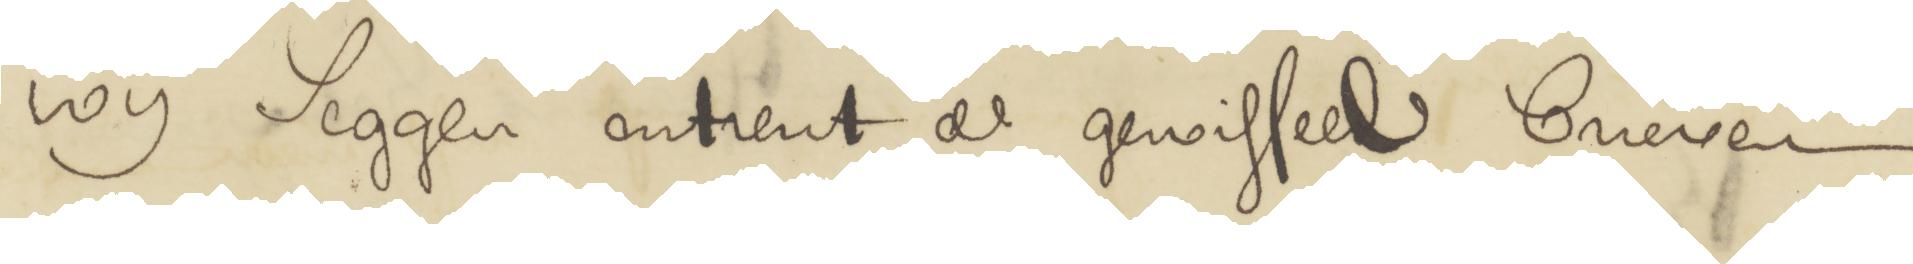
wij seggen ontrent de gewisselde brieven
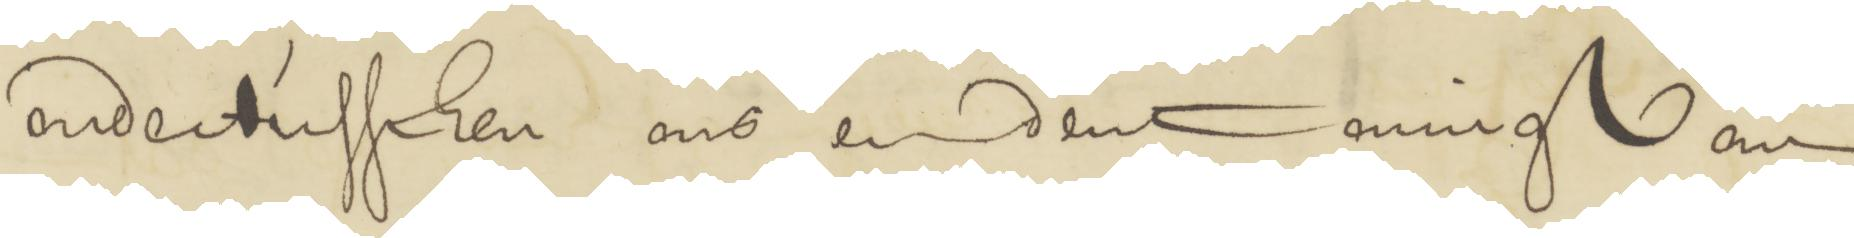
ondertusschen ons en den coning van
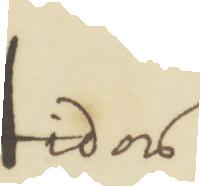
tidor
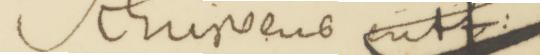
schrijvens ontf:
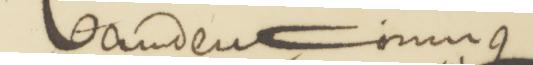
van den coning
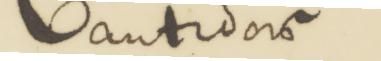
van tidor
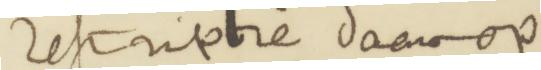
rescriptie daar op
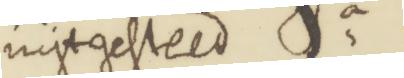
uijtgesteld &:a
